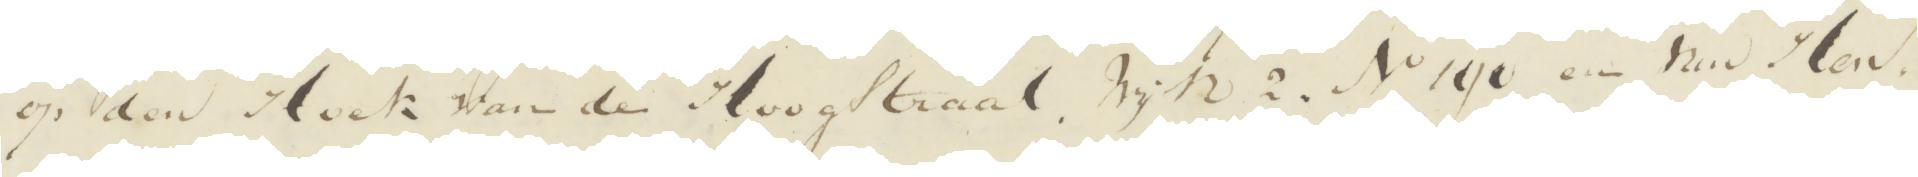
op den Hoek van de Hoogstraat, Wijk 2. No 190 en van Hen,
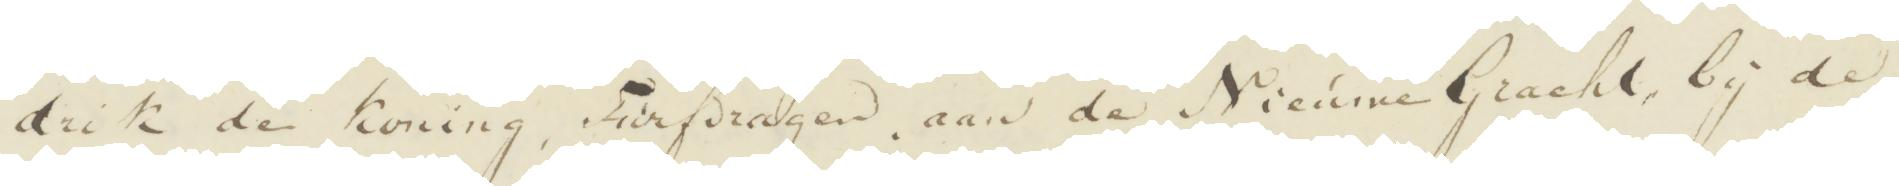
drik de koning, Turfdrager. aan de Nieuwe Gracht, bij de
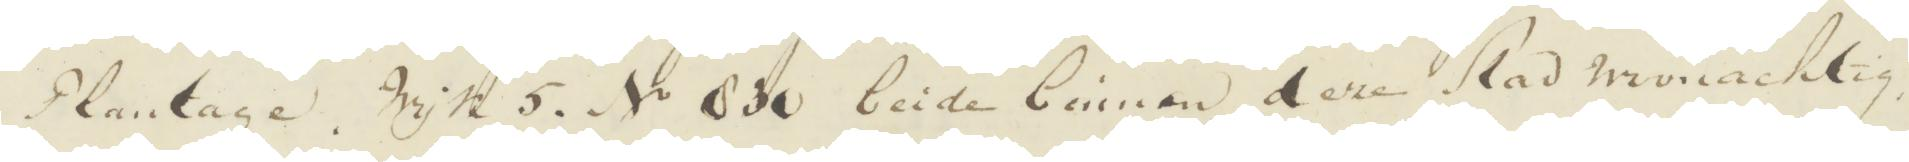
Plantage, Wijk 5. No 830 beide binnen deze stad woonachtig
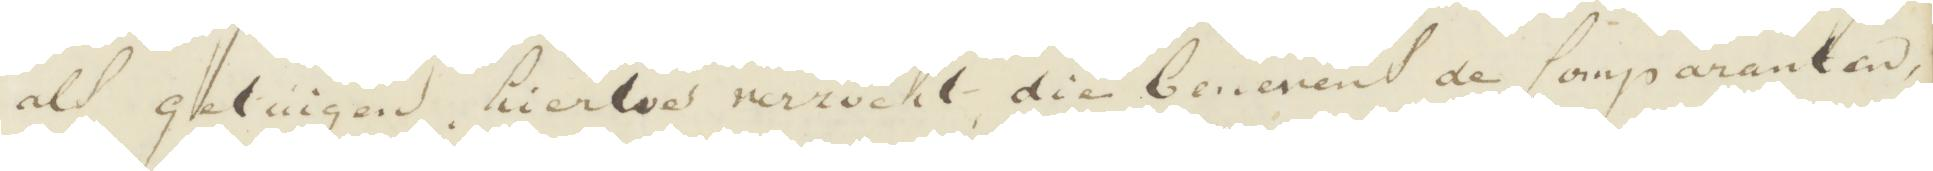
als getuigen, hiertoe verzocht, die benevens de Comparanten,
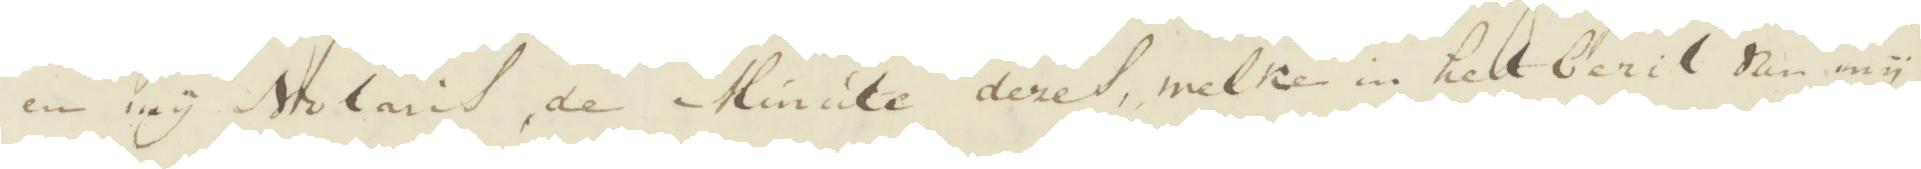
en mij Notaris, de Minute dezes, welke in het bezit van mij
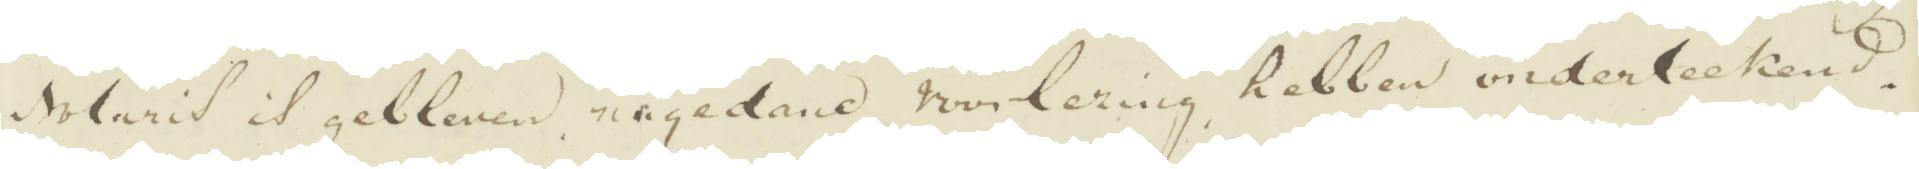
Notaris is gebleven, nagedane voorlezing, hebben onderteekend.
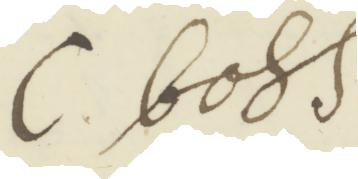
C. boss
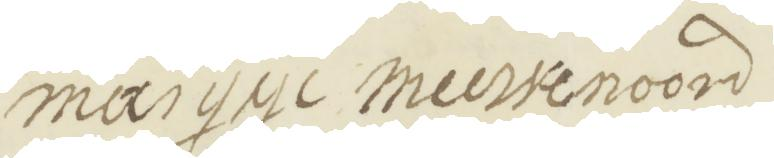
maryye meewenoord
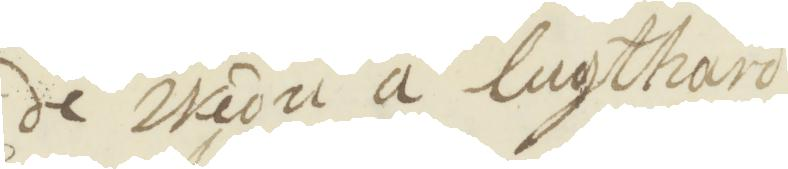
de Wedu a lugthard
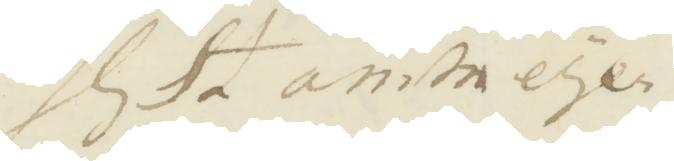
H Stammeijer
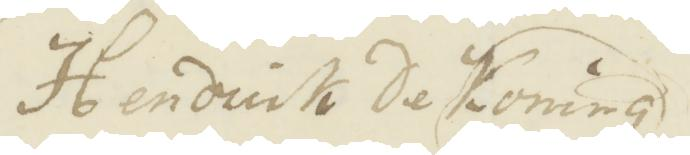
Hendrik de Koning
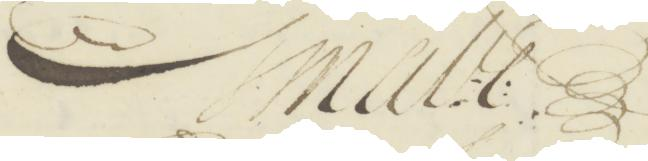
s:: mabé
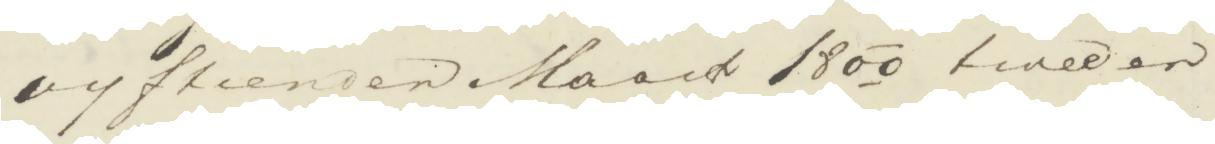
vyftienden Maart 1800 twee en
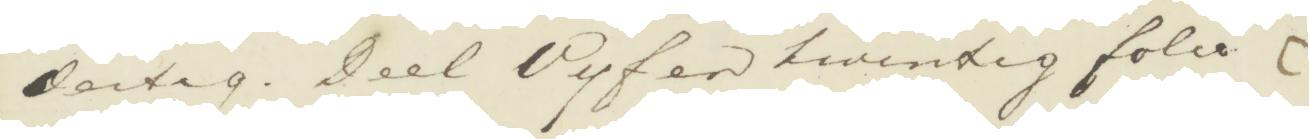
dertig. Deel Vyf en twintig folio
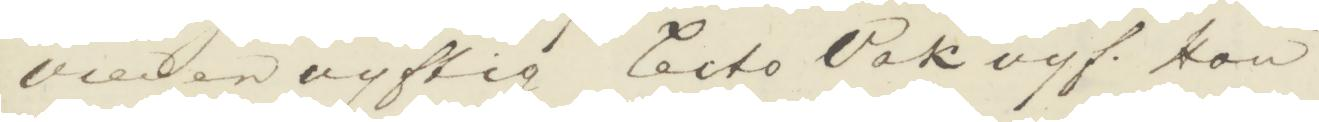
vier en vyftig Recto Vak vyf. Hou
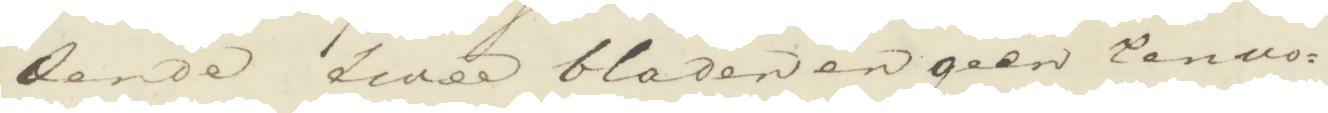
dende twee bladen en geen renvo=
